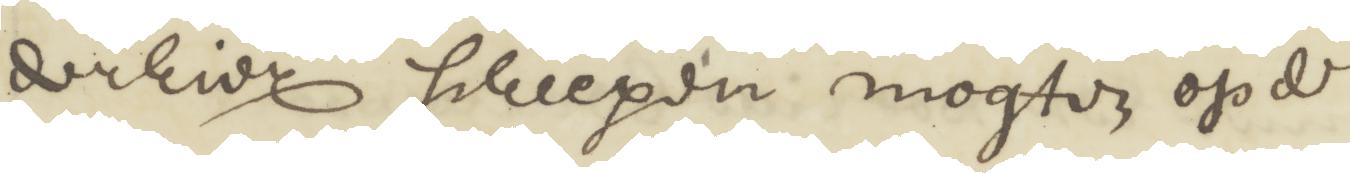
der hier scheepen mogten op de
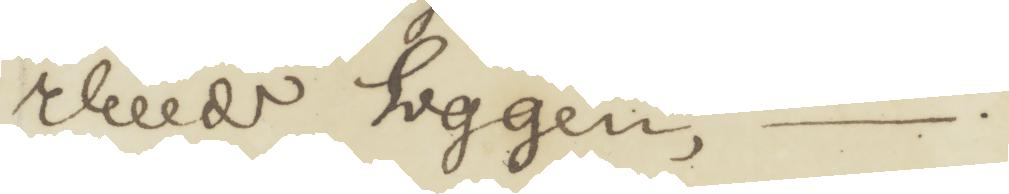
rheede leggen; —.
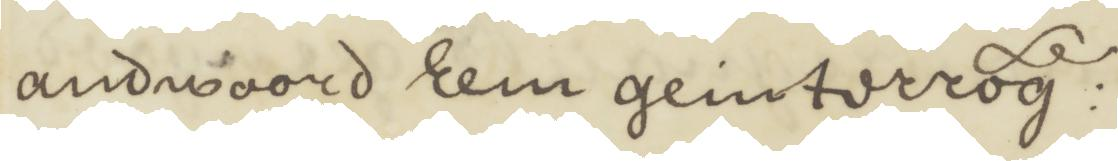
andwoord hem geinterrog:te
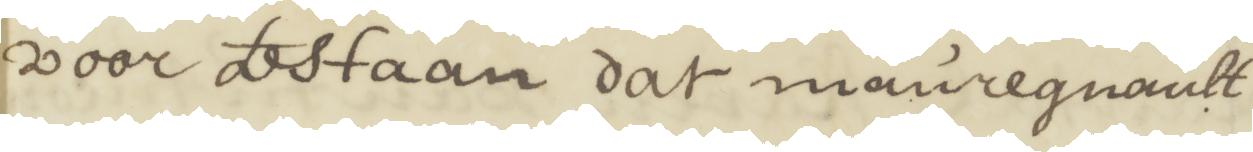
voor testaan dat mauregnault
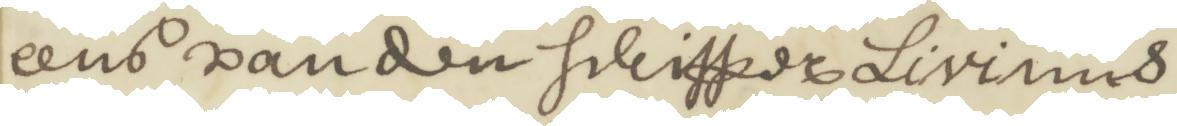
eens van den schipper Livinus
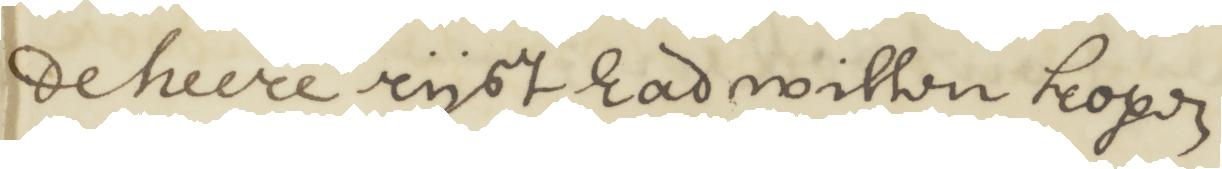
de heere rijst had willen kopen
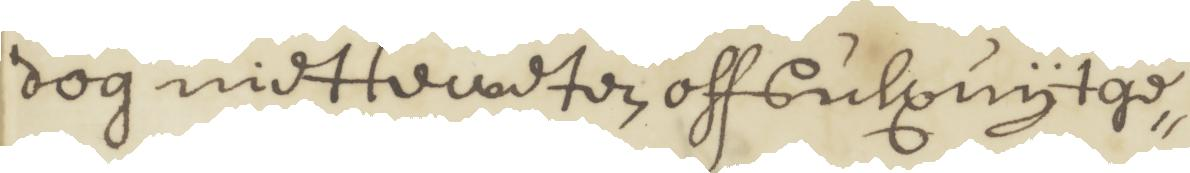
dog niet te weten off sulx uijtge„
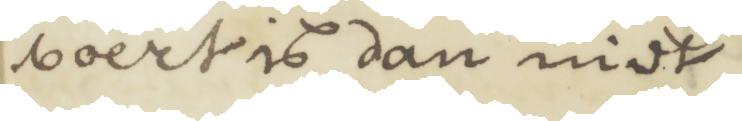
voert is dan niet
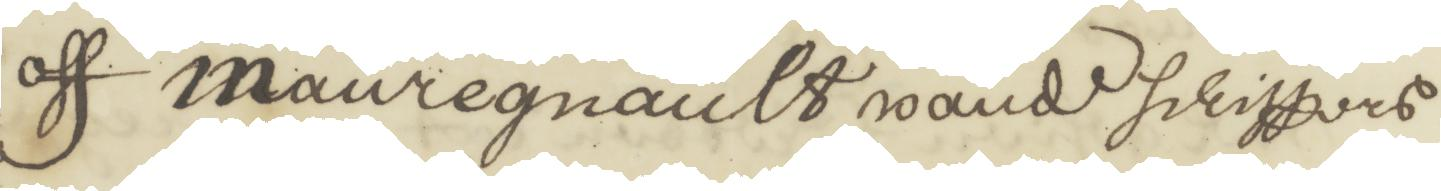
off manregnault vande schippers
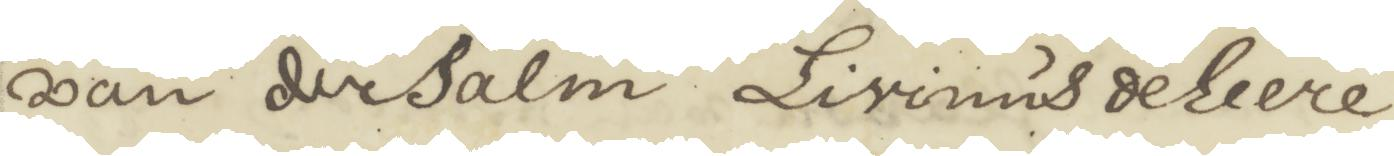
van der salm Livinus de heere
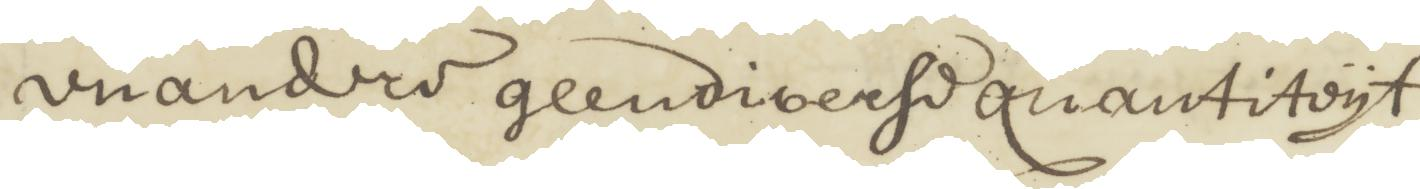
en andere geen diverse quantiteijt
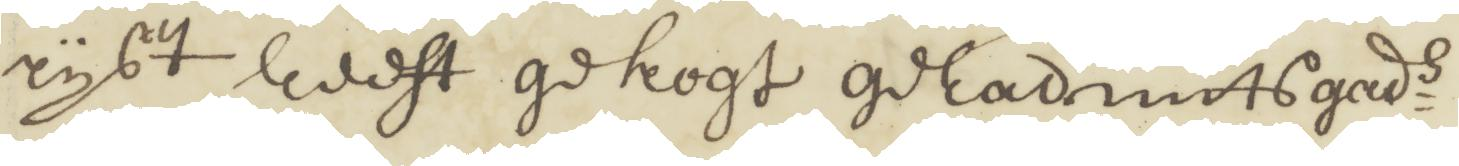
rijst heeft gekogt gehad mitsgad=s
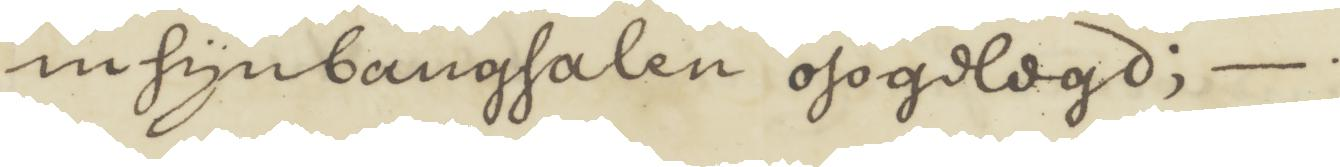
in sijn bangsalen opgelegd; —.
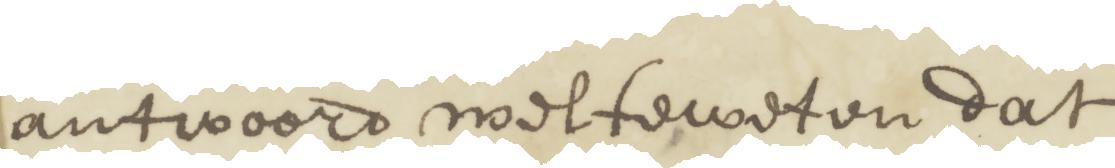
antwoord wel te weten dat
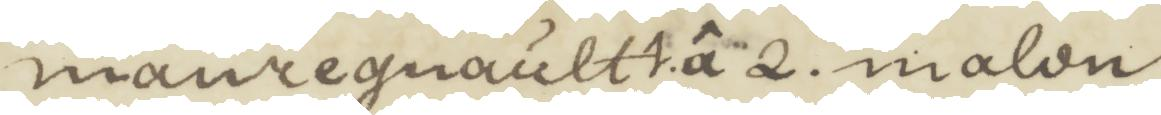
mauregnault 1. â 2. malen
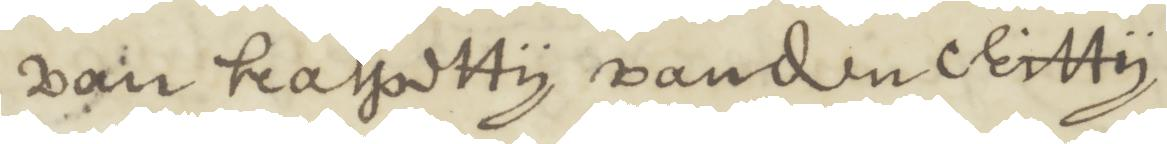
van kalpettij van den chittij
